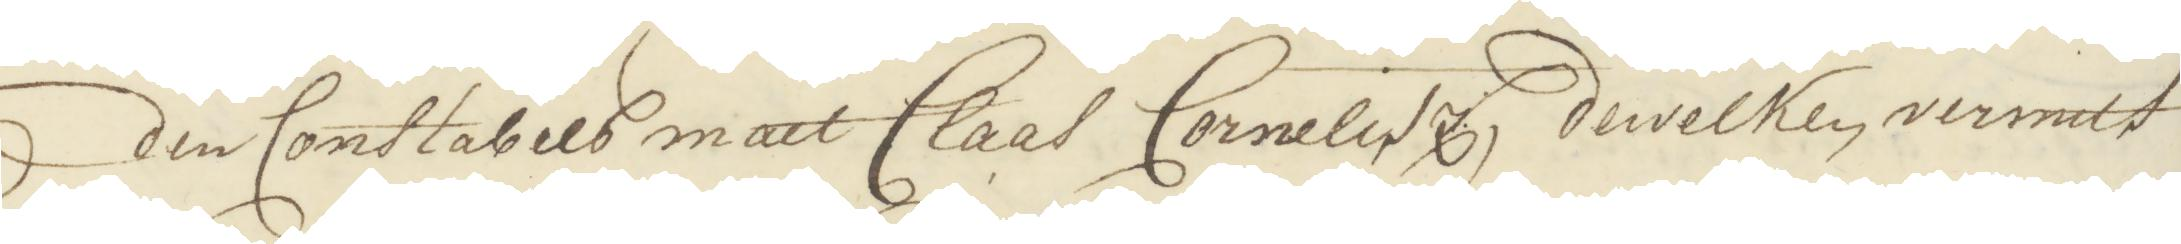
den Constabels maet Claas Cornelisz, dewelken vermits
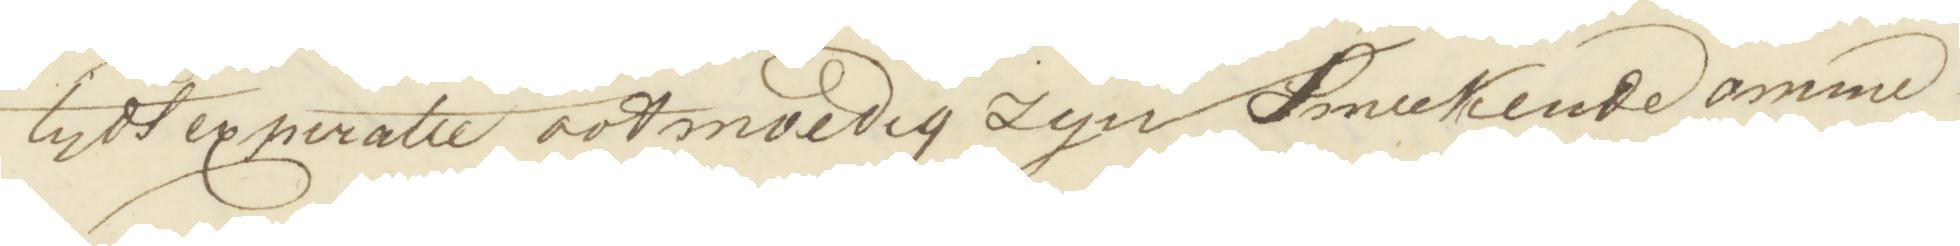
tyds expiratie ootmoedig zijn smeekende omme
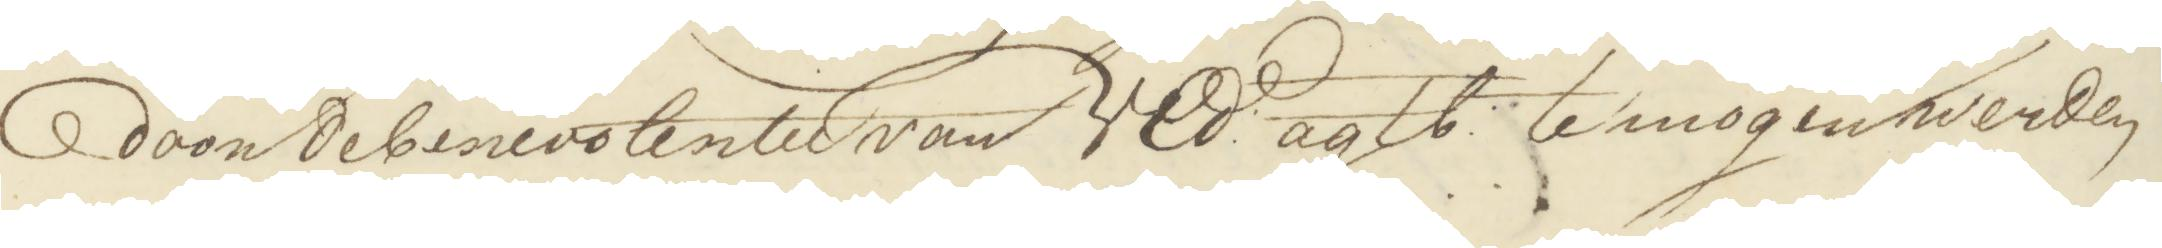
door de benevolentie van VEd:e agtb: te mogen werden
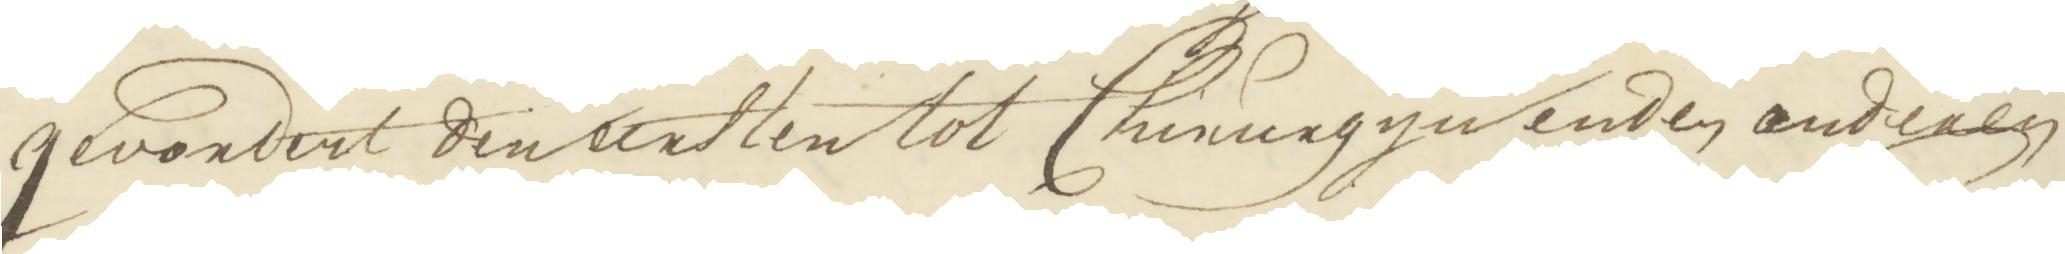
gevordert den eersten tot Chirurgijn enden anderen
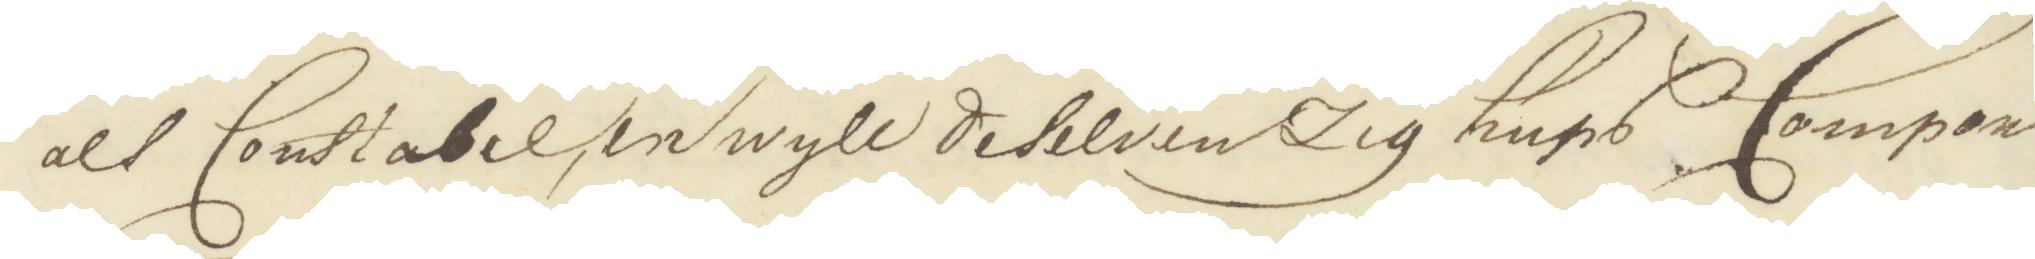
als Constabel, en wijle deselven zig hups Compor
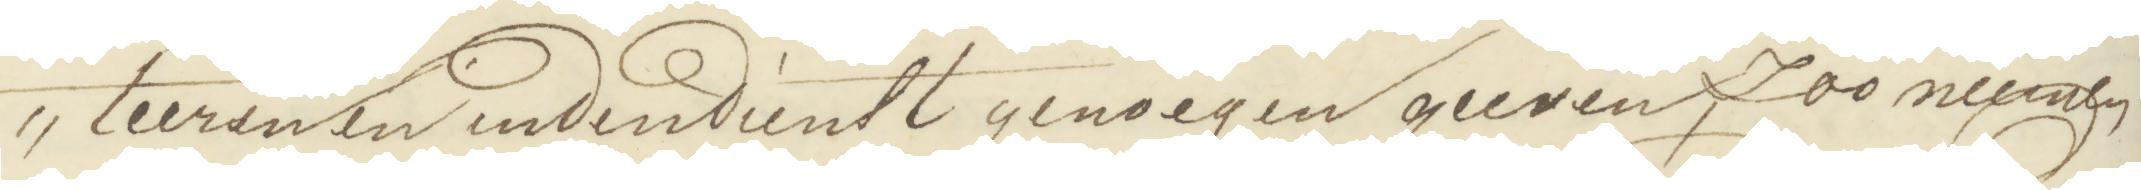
„teeren en inden dienst genoegen geeven, zoo neemen
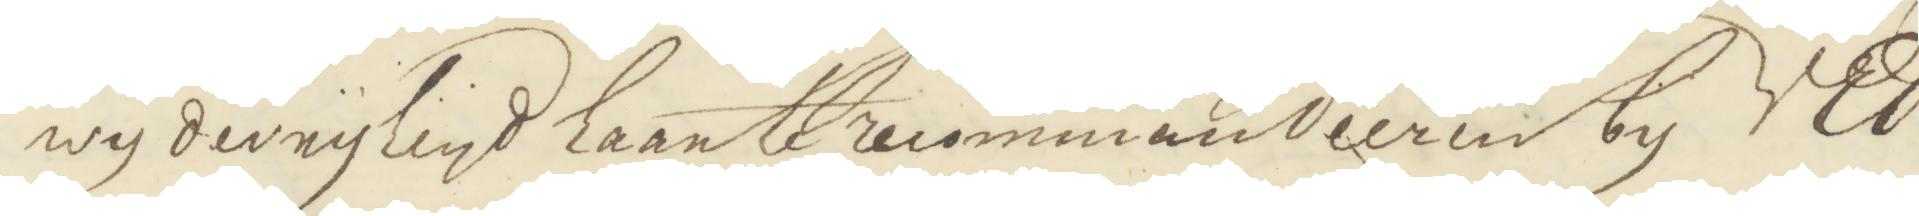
wij de vrijheijd haar te recommandeeren by VEd
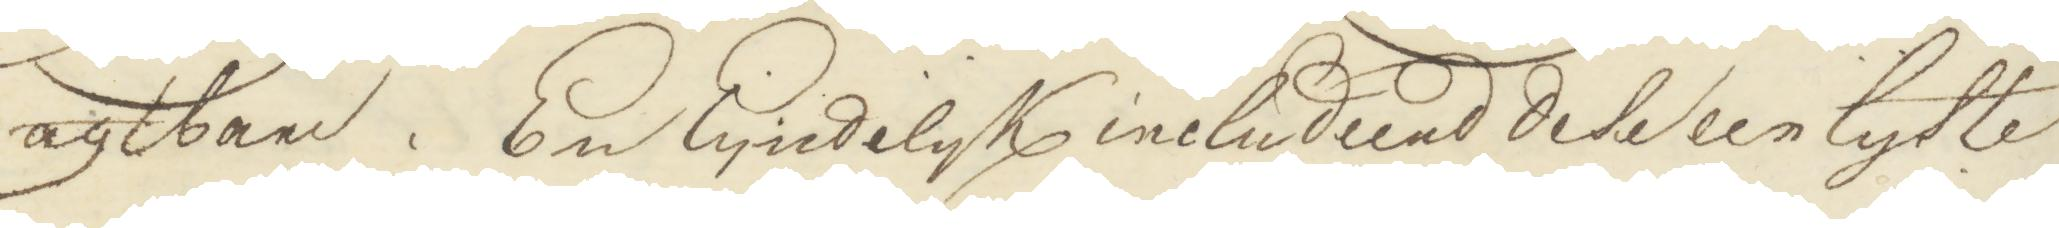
agtbare. En Eijndelijk includeerd dese een lijste
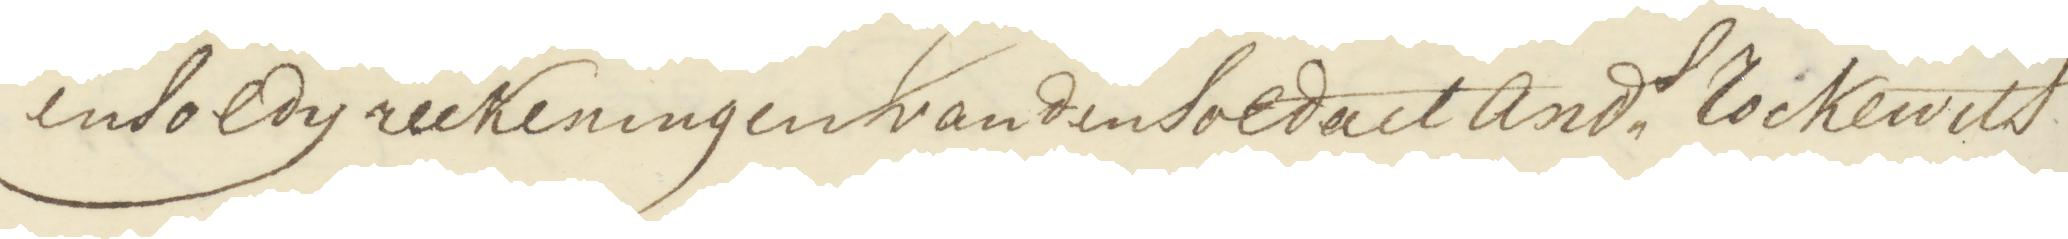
ensoldij reekeningen van den soldaet And„s rockewits
